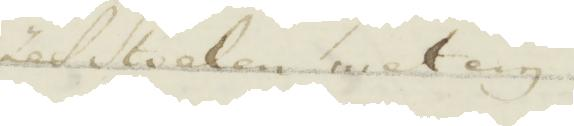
Zes Stoelen met enz
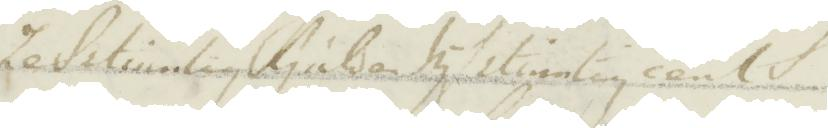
Zes en twintig Gulden vijf en twintig cents
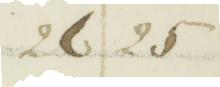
26 25
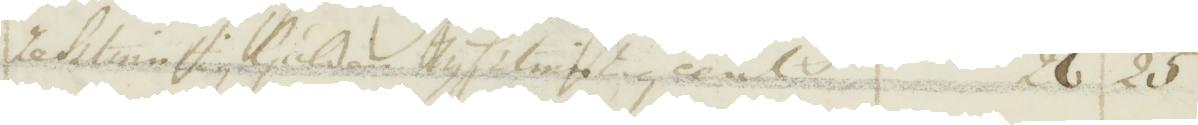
Zes en twintig Gulden vijf en twintig cents 26 25
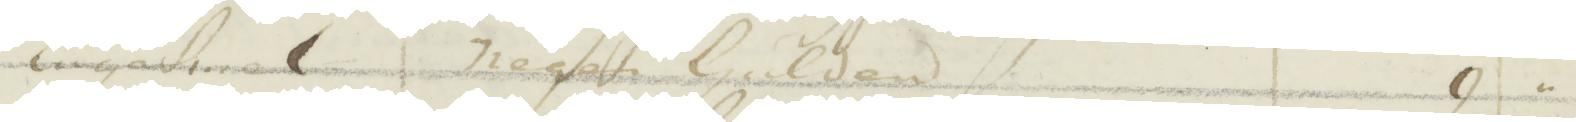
Engesmet Negen Gulden 9 „
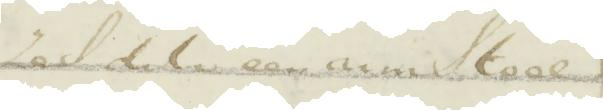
Zes dito een armstoel
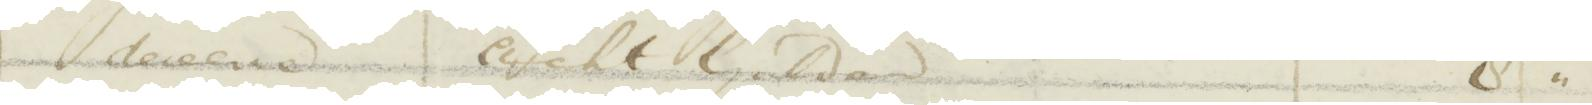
dezelve acht Gulden 8 „
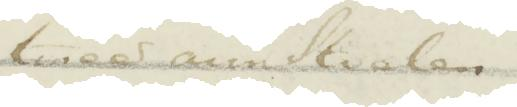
twee armstoelen
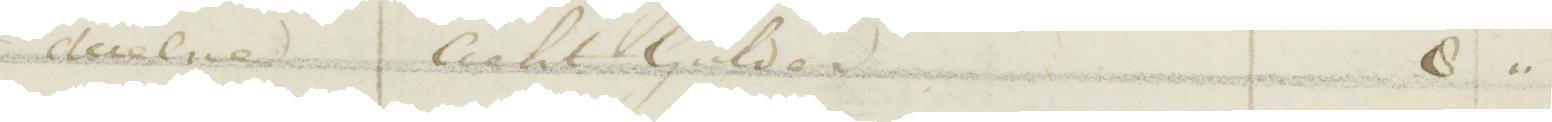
dezelve Acht Gulden 8 „
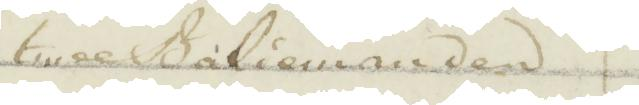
twee Baliemanden
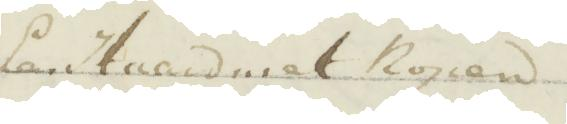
Een Haard met Koper
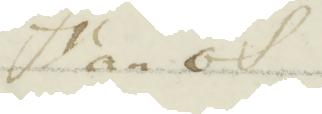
Van os
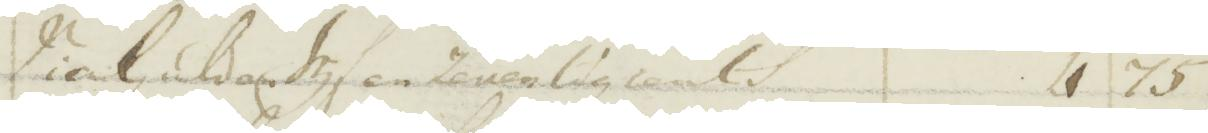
Vier Gulden vijfen zeventig cents 4 75
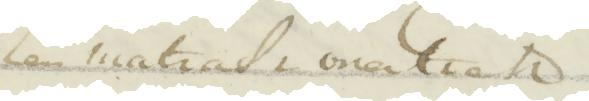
Een matras en overtrek
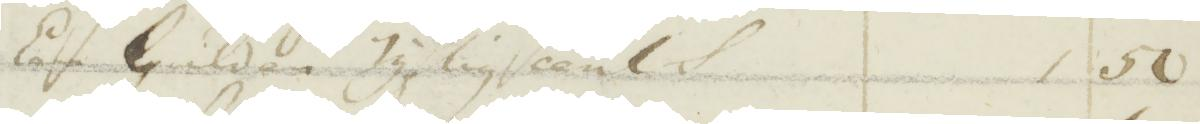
Een Gulden vijftig cents 1 50
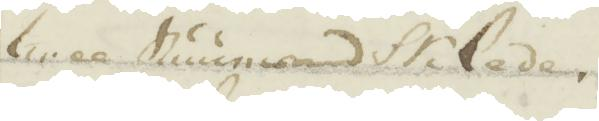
twee Huusmandskleden
